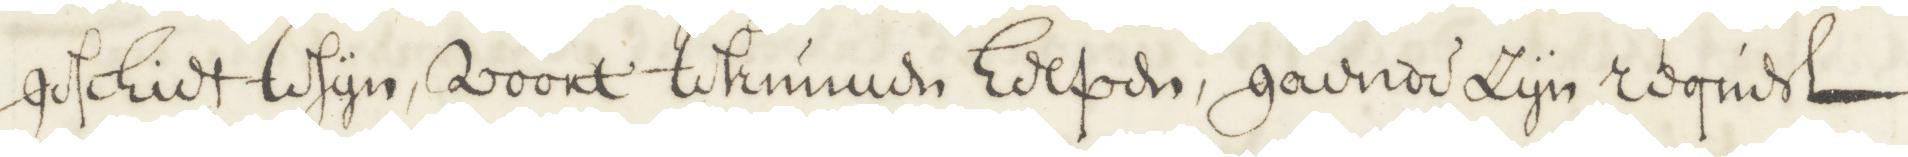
geschiet tesijn, voort te kunnen helpen, gaende zijn request
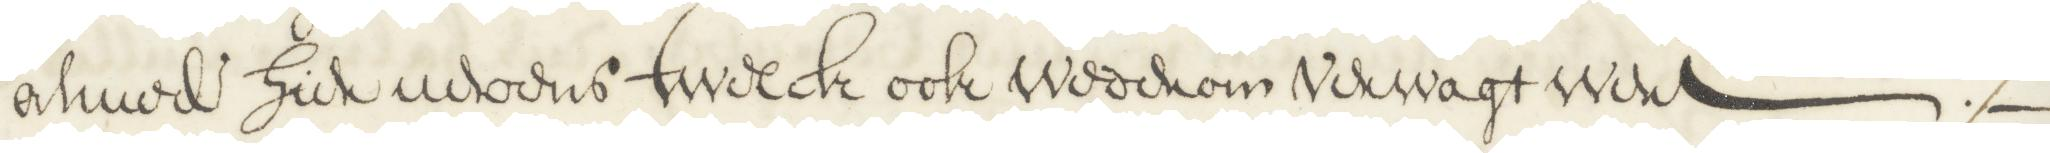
almede hier nevens twelck ook wederom verwagt wert. /—
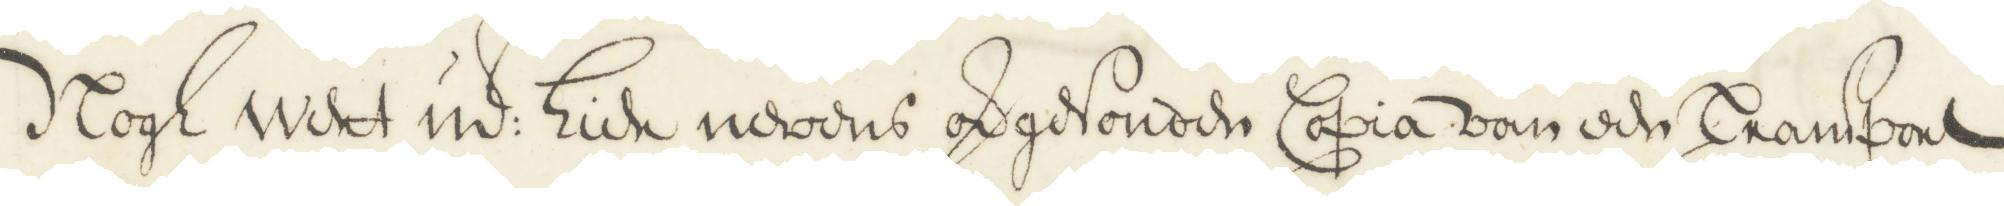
Nogh wert uE: hier nevens overgesonden Copia van een Transport
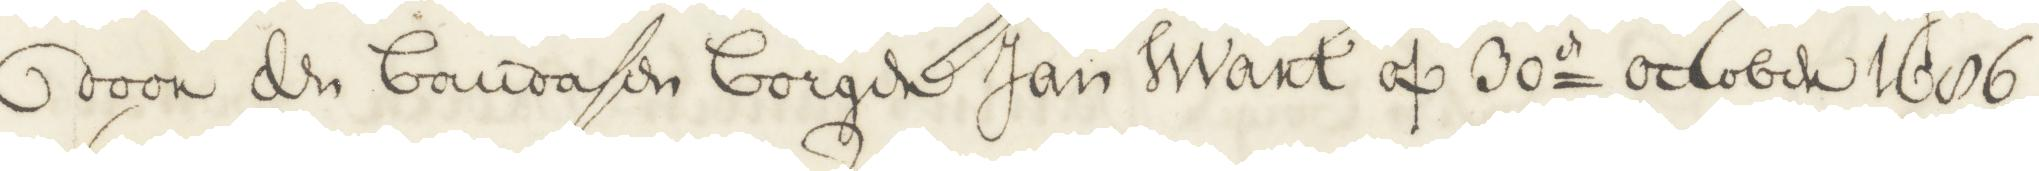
door den bandasen borger Jan Swart op 30=en october 1686
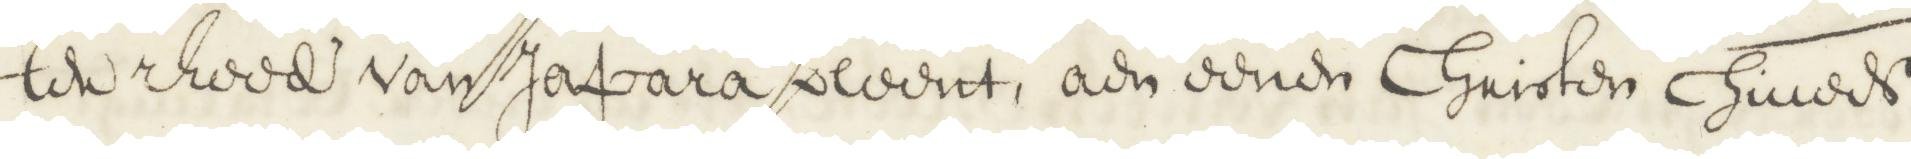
ter rheede van Japara verleent, aen eenen Christen Chinees
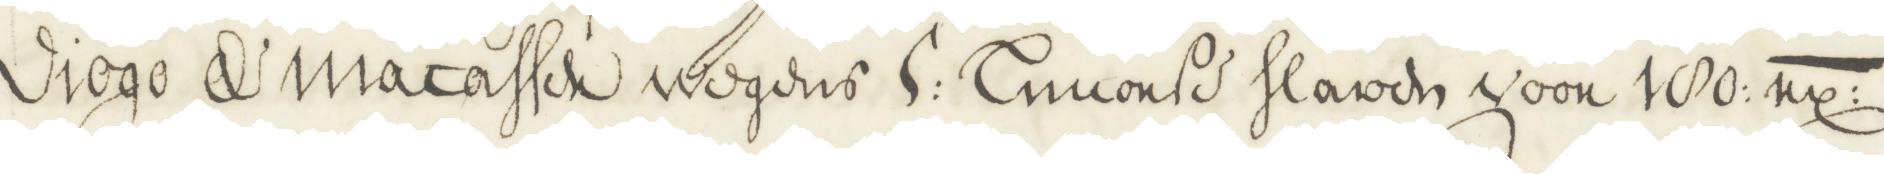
Viogo de macasser wegens 5: Timorse slaven voor 180: rx:
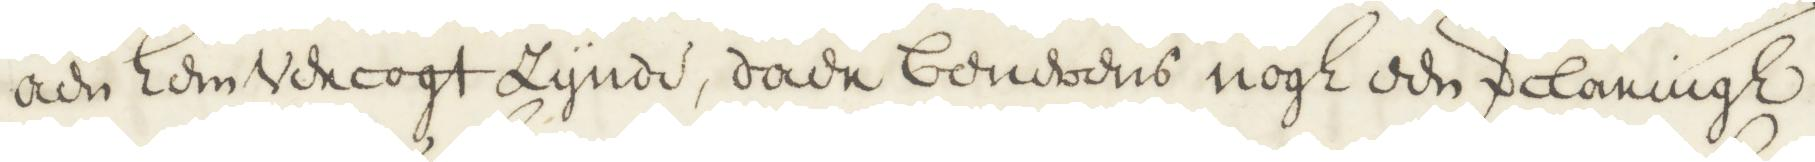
aen hem vercogt zijnde, daer benevens nogh een verclaringh
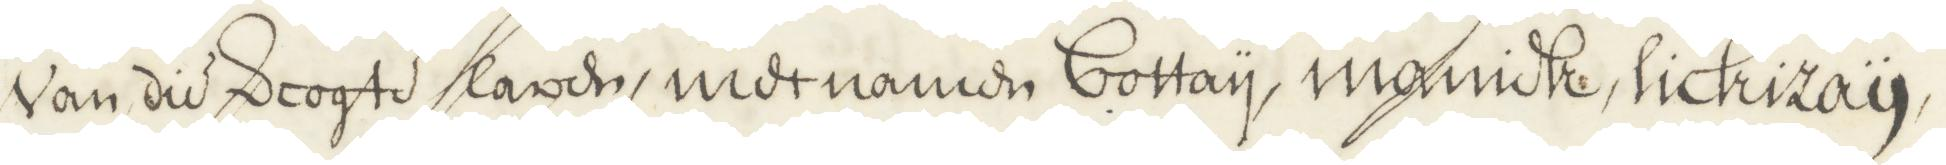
van die vercogte slaven, met namen bottaij, maniek, lickizaij,
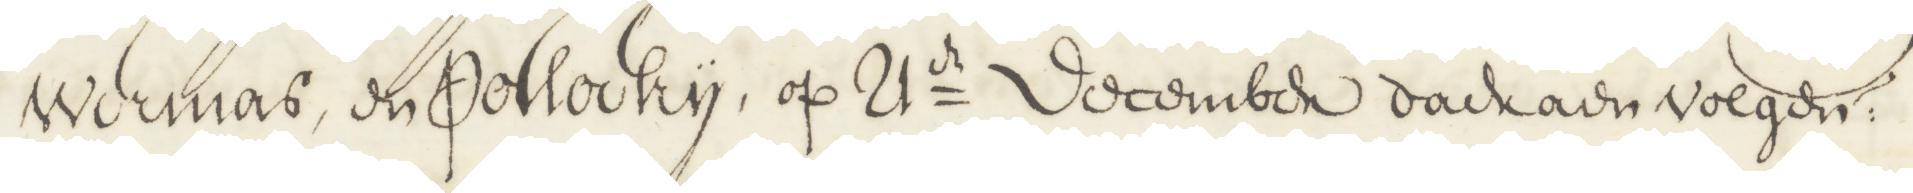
wermas, en potloekij, op 21=en December daer aen volgen:
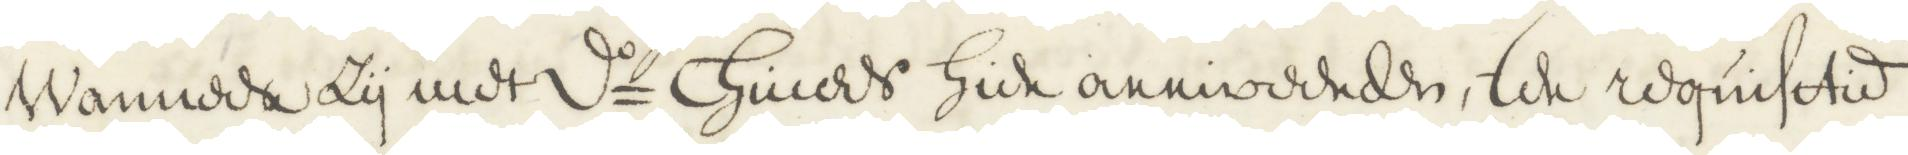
wanneer zij met D=o Chinees hier arriveerden, ter requisitie
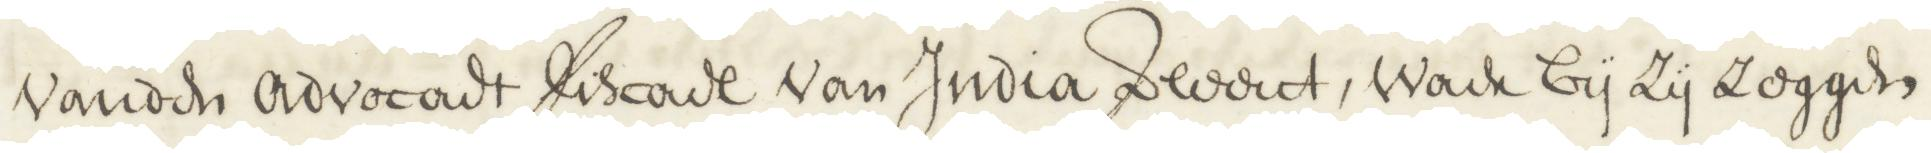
van den advocaet fiscael van Jndia verleent, waer bij zij zeggen
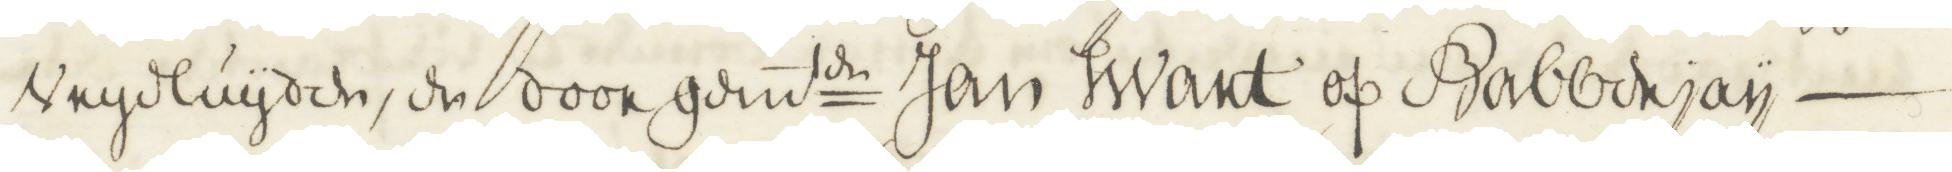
vryeluijden, en door gem=ten Jan swart op Babberjaij —
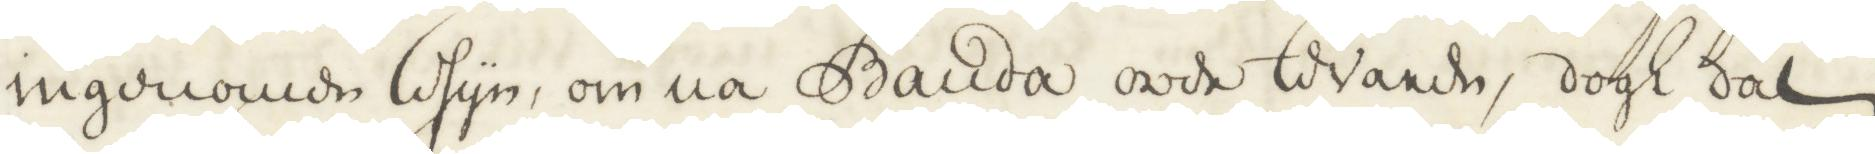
ingenomen tesijn, om na Banda over tevaren, dogh dat
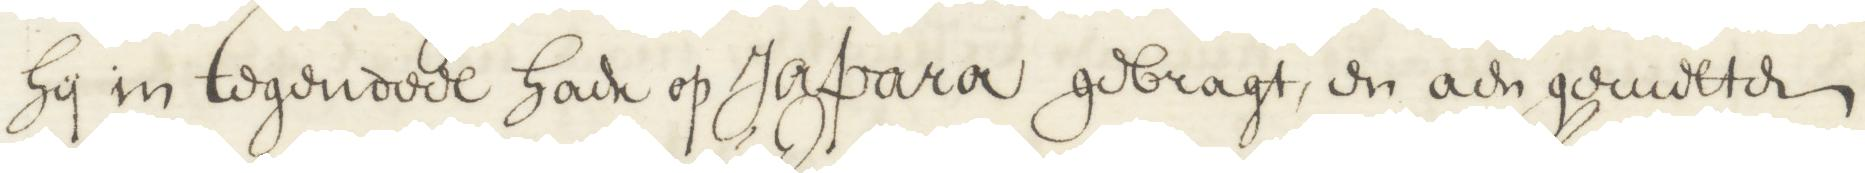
hij in tegendeel haer op Japara gebragt, en aen gemelten
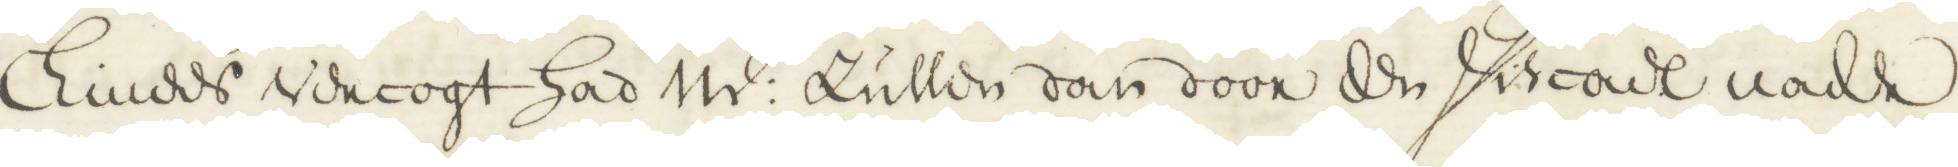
Chinees vercogt had uE: zullen dan door den fiscael nader
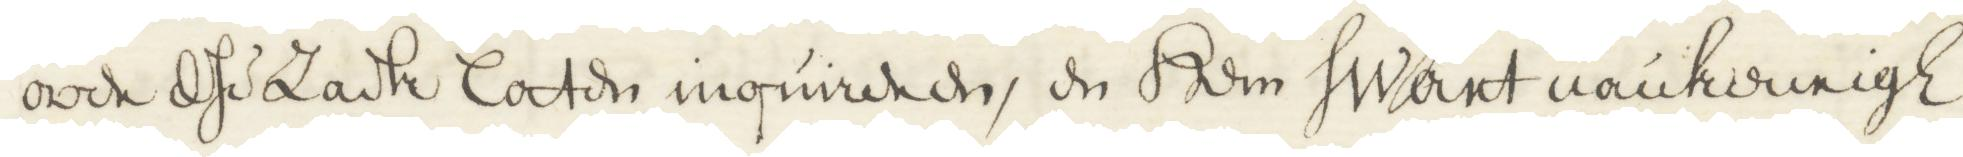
over dese zaek laten inquireren, en hem swart naukeurigh
